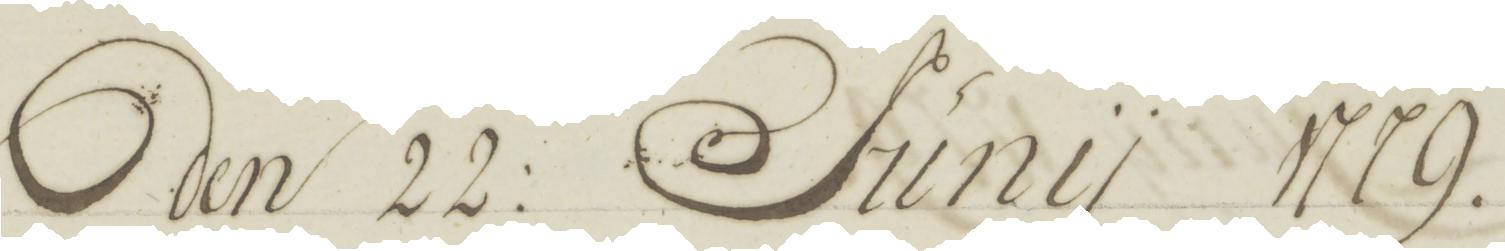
den 22:e Junij 1779.
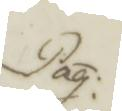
Pag
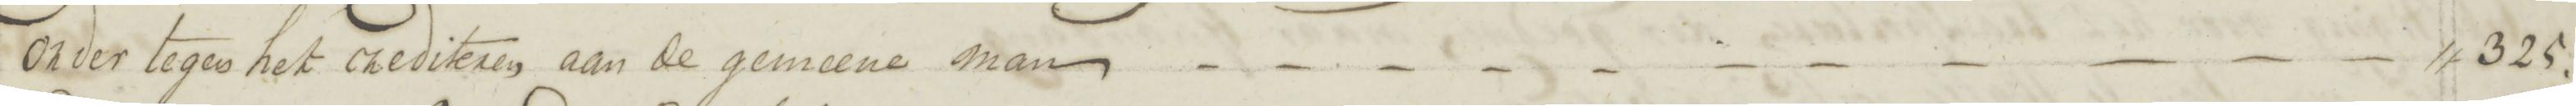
order tegen het crediteren aan de gemeene man – – – – – – – – — — — „ 325
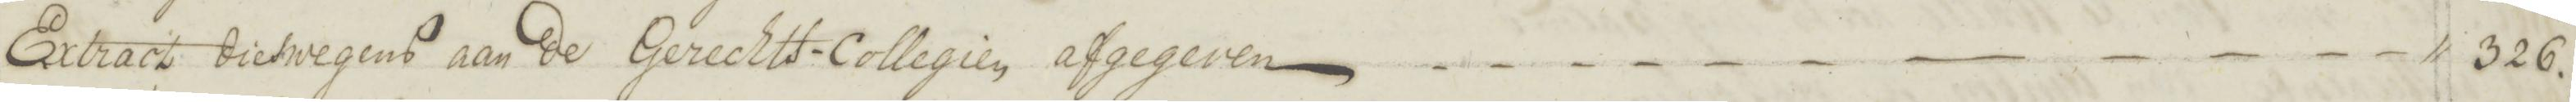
Extract dieswegens aan de Gerechts-Collegien afgegeven - – – – – – — — — — — — „ 326.
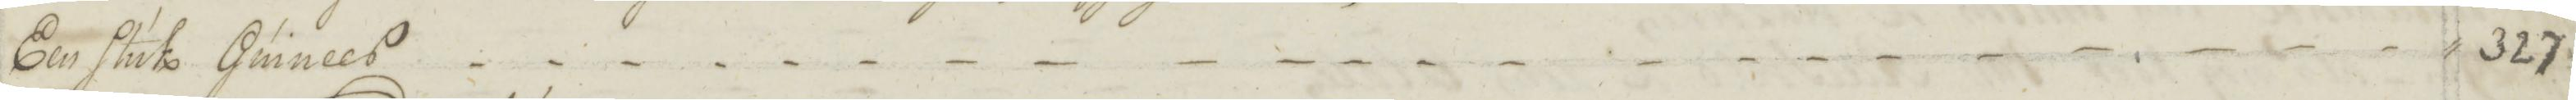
Een stuk Guinees - - - - - - – – – – – – – – – – – – – . – – – „ 327
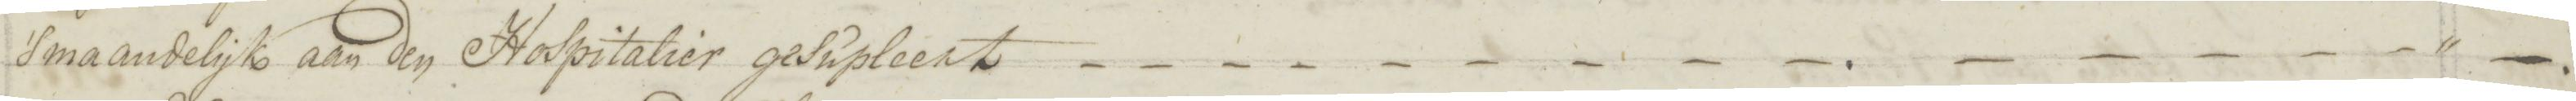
'smaandelijk aan den Hospitalier gesupleert – – – – – – – – — . — — — — – „ — .
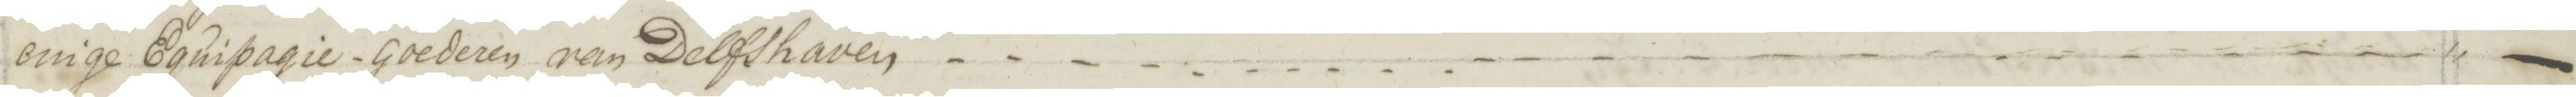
enige Equipagie-goederen van Delfshaven - - – - - - - - - - - - - – – – – - - - - - – – - „ —
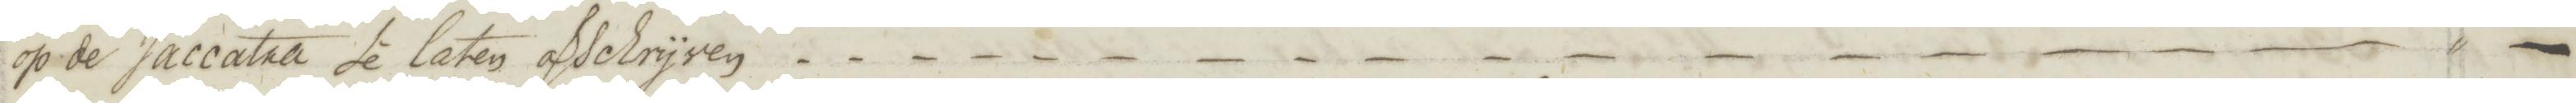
op de Jaccatra te laten overschrijven - – – — — — — — — — — — — — — — — „ —
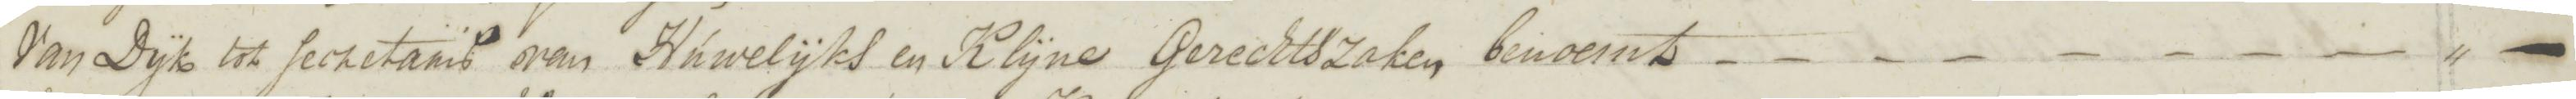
Van Dijk tot secretaris van Huwelijks en Klijne Gerechtszaken benoemt – – – – – – – — „ —
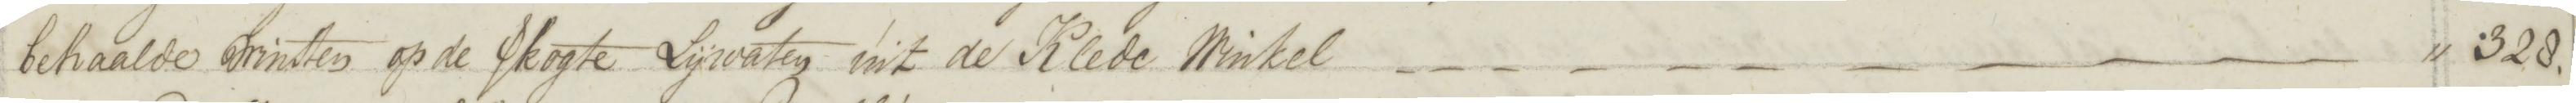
behaalde winsten op de verkogte Lijwaten uit de Klede Winkel – – – – — — — — — — — „ 328.
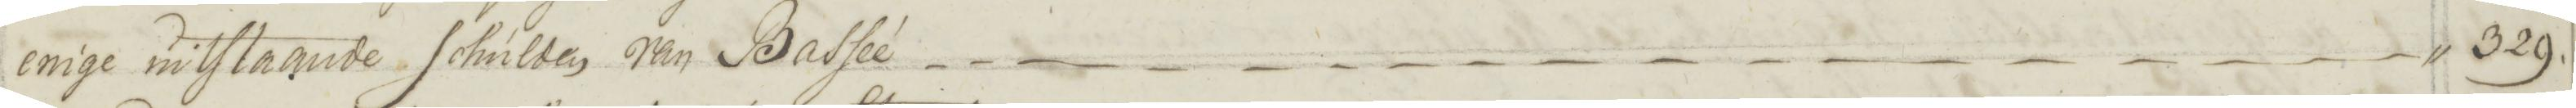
enige uitstaande schulden van Basseé – – — — — — — — — — — — — — — — — — „ 329
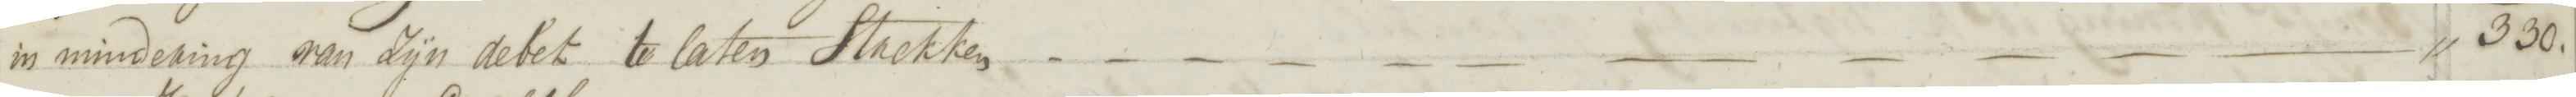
in mindering van zijn debet te laten strekken - — — — — — — — — — — — „ 330.
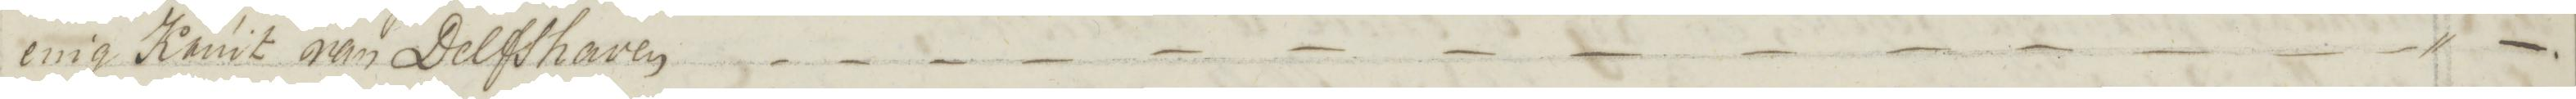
enig Kruit van Delfshaven – – — — — — — — — — — — — — „ — .
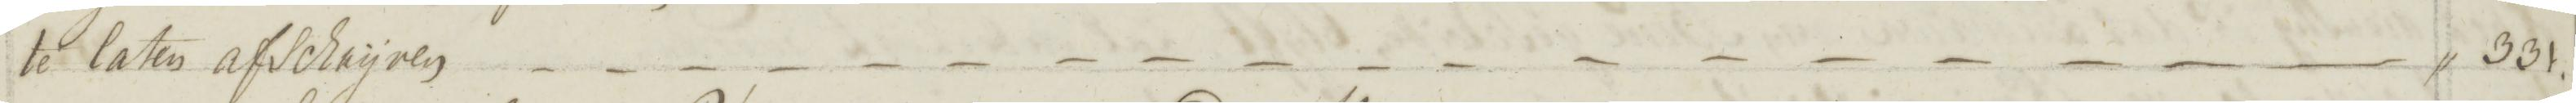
te laten afschrijven – – – – — — — — — — — — — — — — — — „ 331.
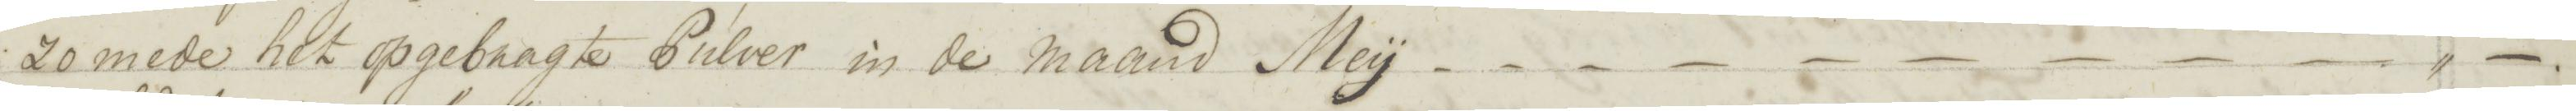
zo mede het opgebragte Pulver in de maand Meij – – – — — — — — — „ — .
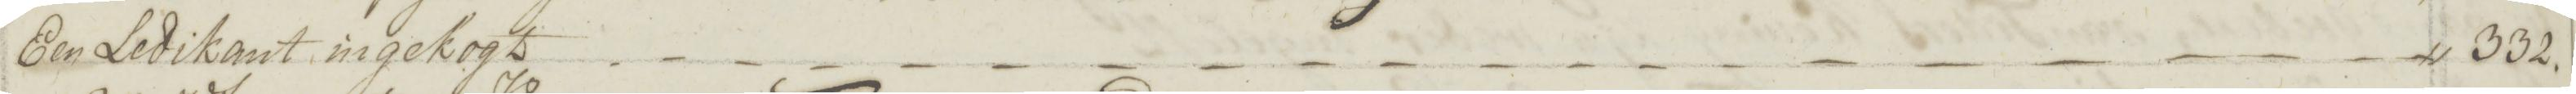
Een Ledikant ingekogt - – – – – – – – – – – – – – — — — — — — „ 332.
